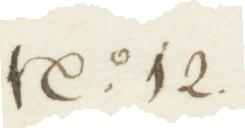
N:o 12.
